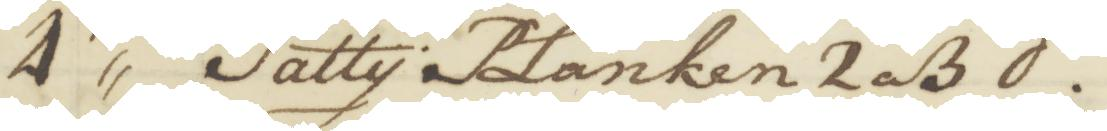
4 „ Iattij Planken 2 a3 dm
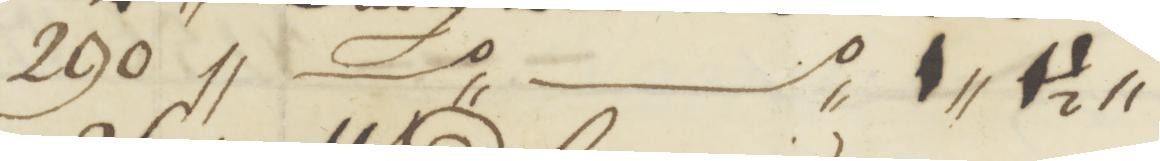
290 „ d„o d„o 1 „ 1½ „
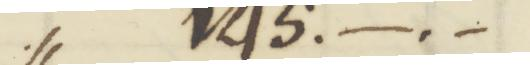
-„ 145.—.—
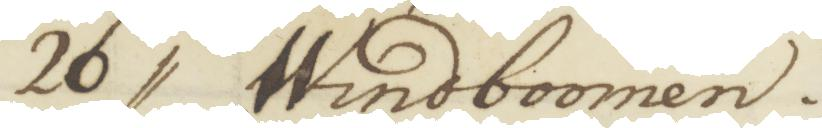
26 „ Windboomen
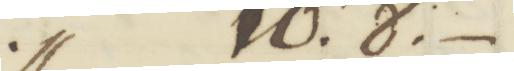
-„ 10.8.—
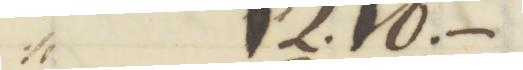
„ 12.10.-
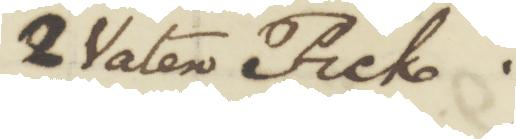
2 vaten Pick
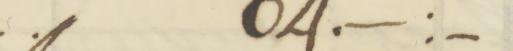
-„ 64.—:—
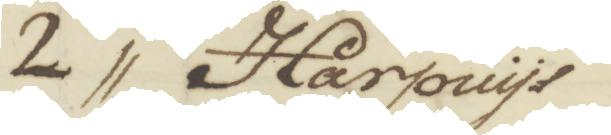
2 „ Harpuijs
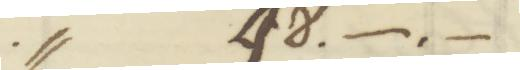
-„ 48.—.—
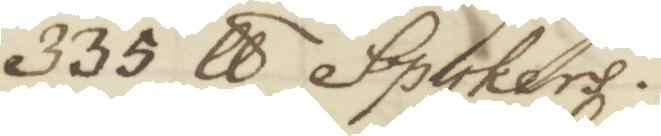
335 lb: Spykers
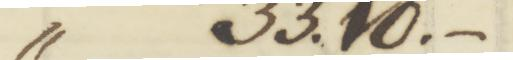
„ 33.10.—
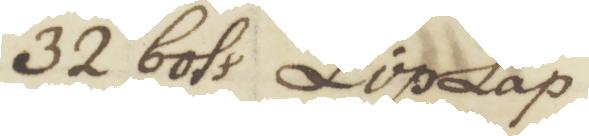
32 boss LipLap
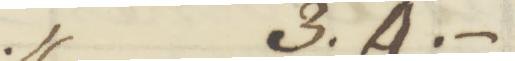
-„ 3.4.—
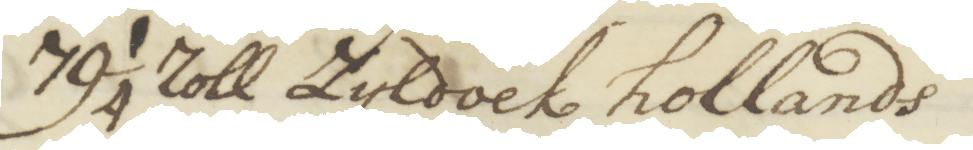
79¼ roll Zyldoek hollands
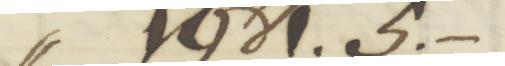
„ 1981.5.—
